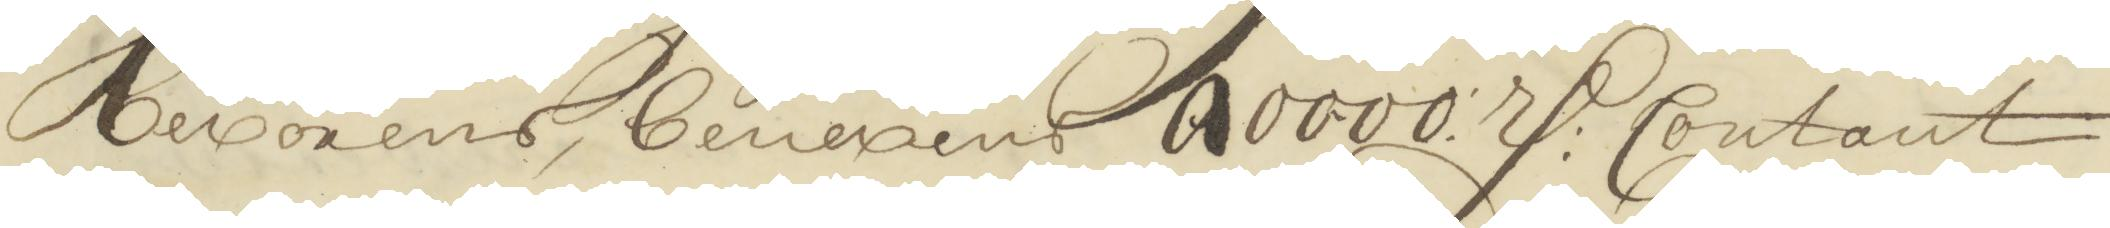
bevorens, benevens 40000: rs: Contant
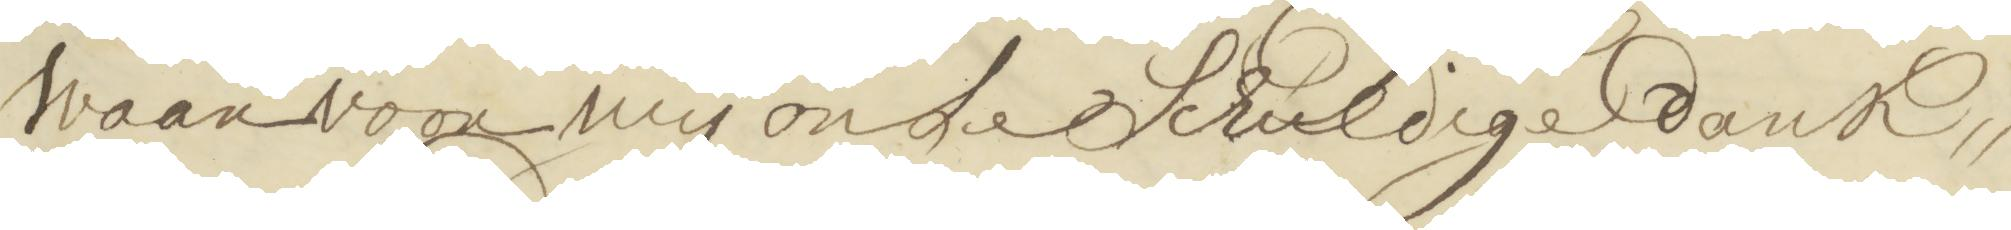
waar voor wij onse schuldige dank„
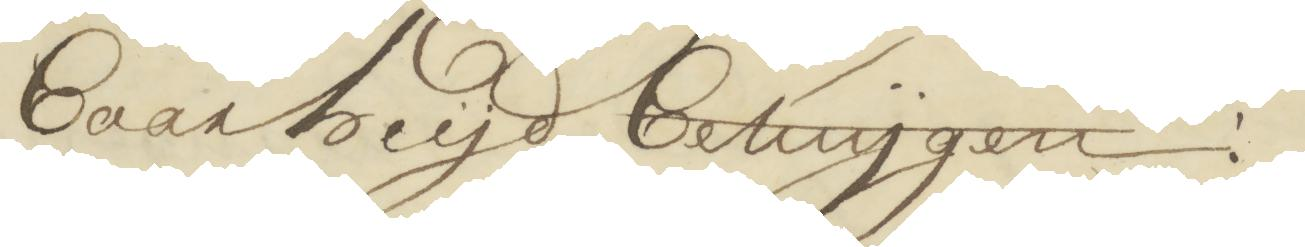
baarheijd betuijgen:
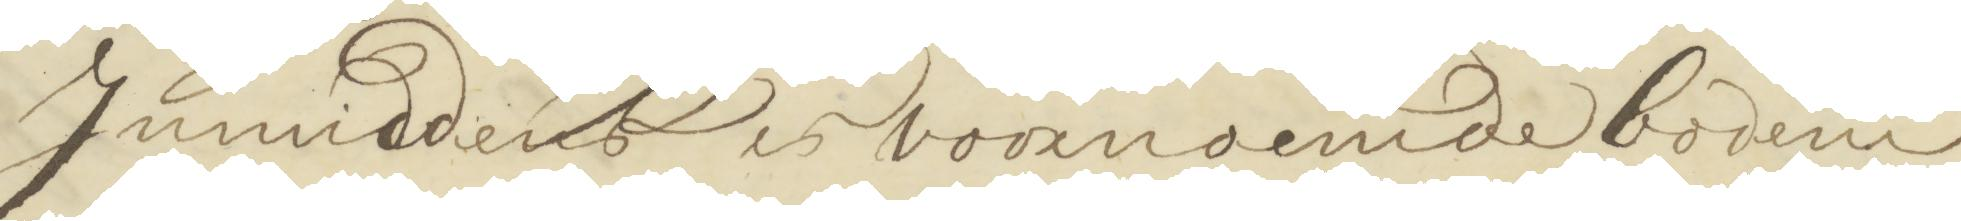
Jnmiddens is voornoemde bodem
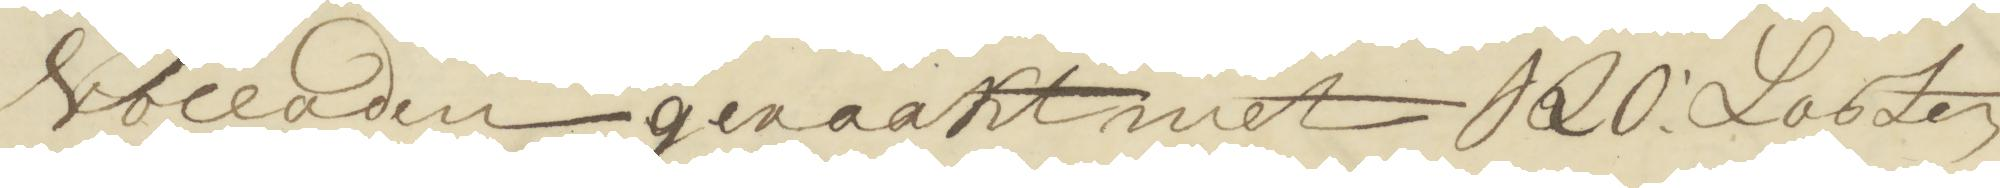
volladen geraakt met 120: Laste
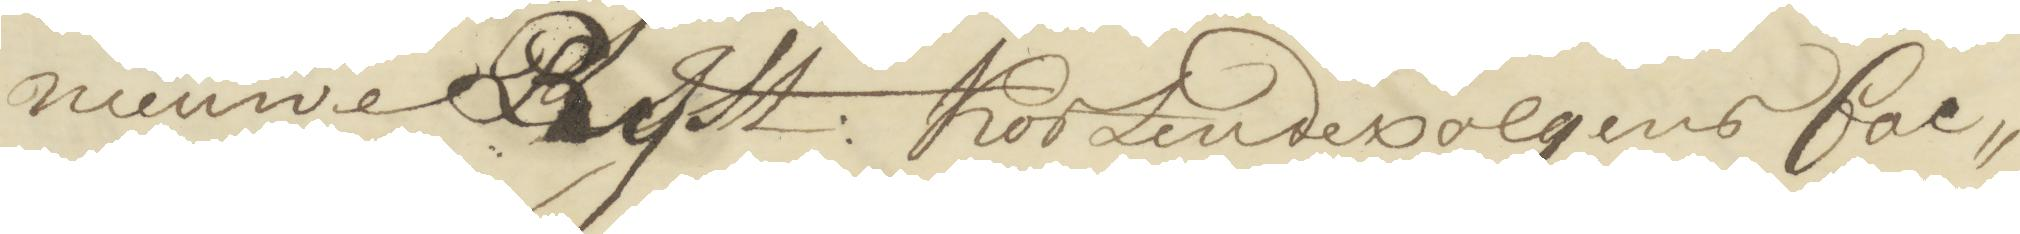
nieuwe Ryst: kosten de volgens fac„
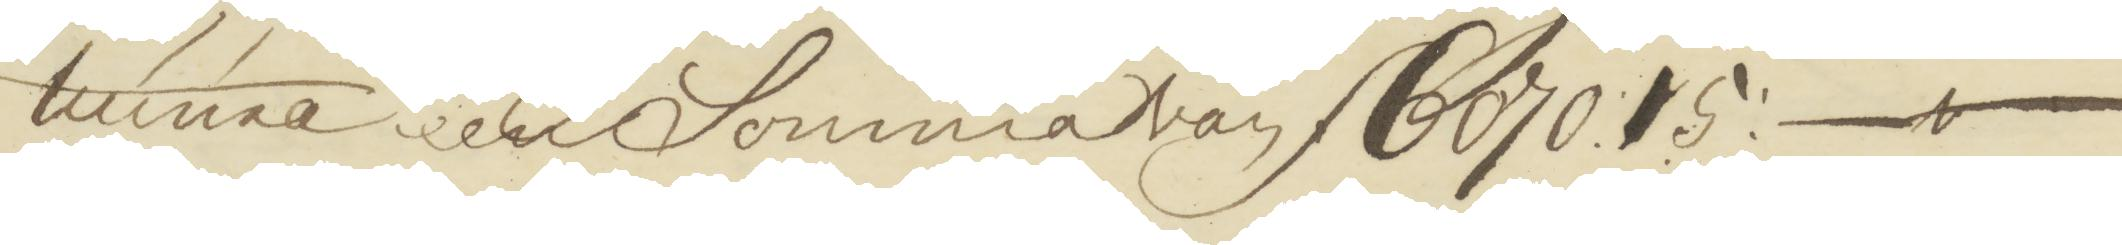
tiuura een somma van ƒ 6070: 15: —
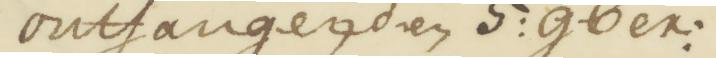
ontfangen den 5: 9ber:
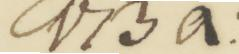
1734.
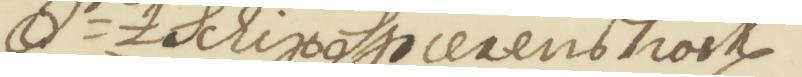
P=r 't schip spierenshoek.
